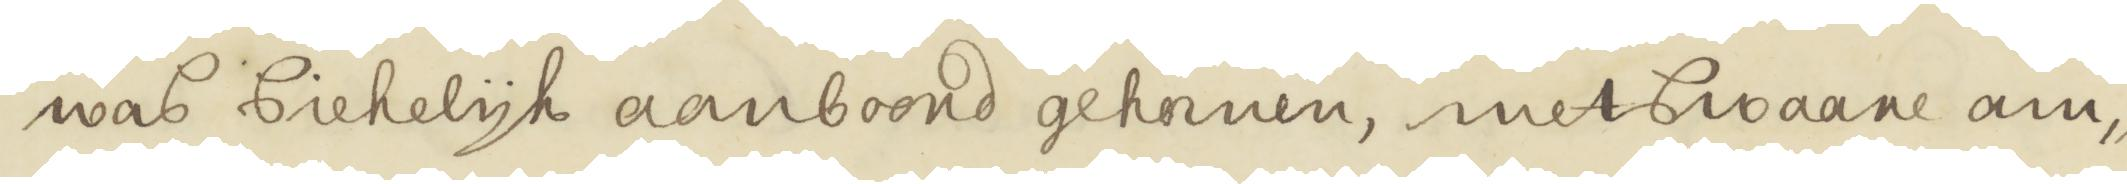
was siekelijk aanboord gekomen, met swaare am„
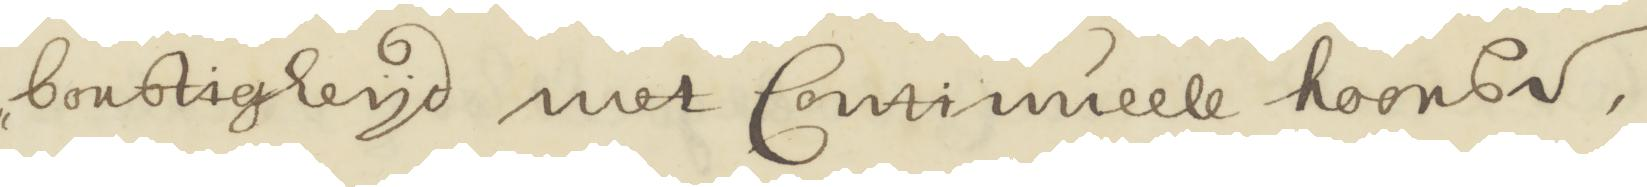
borstigheijd met Continueele koorse,
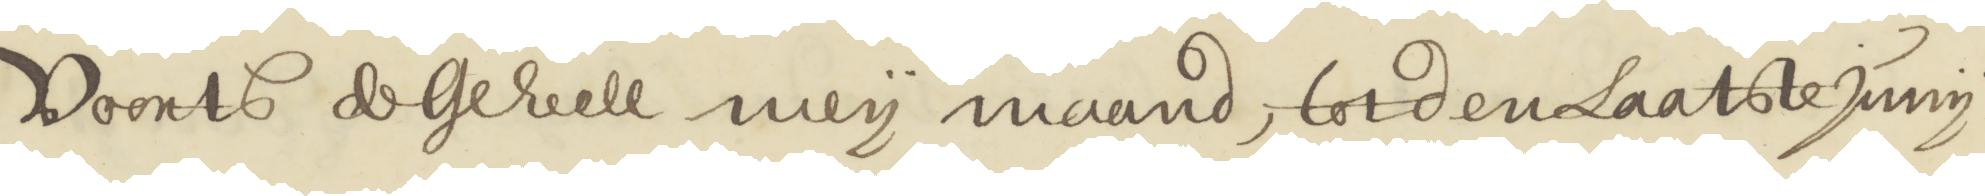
Voorts de geheele meij maand, tot den laatste junij
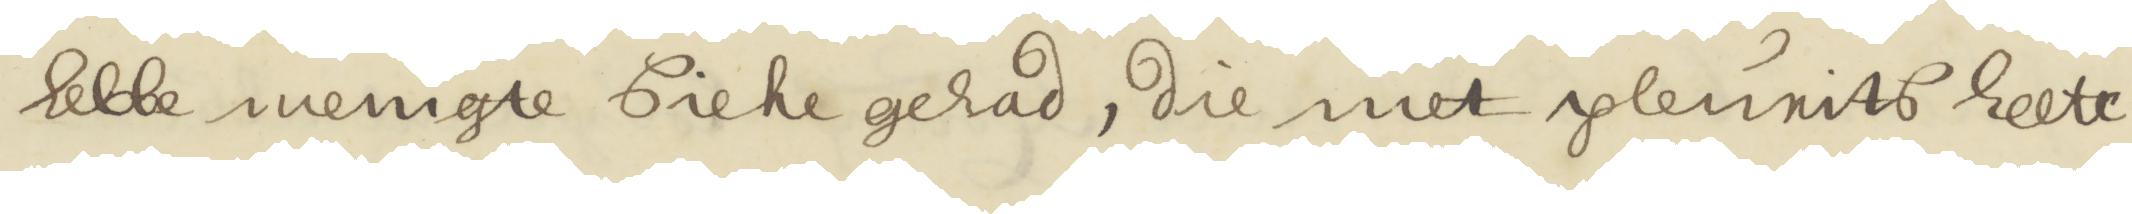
hebbe menigte sieke gehad, die met pleurits heete
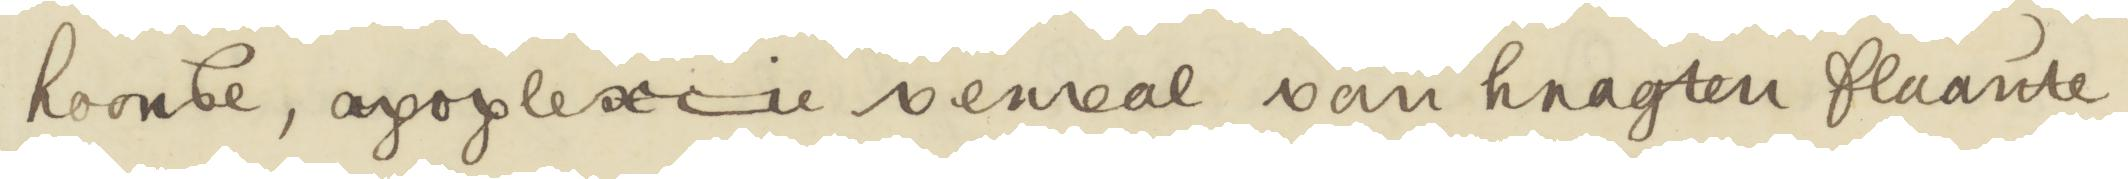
koorse, apoplexcie verval van kragten flaaute
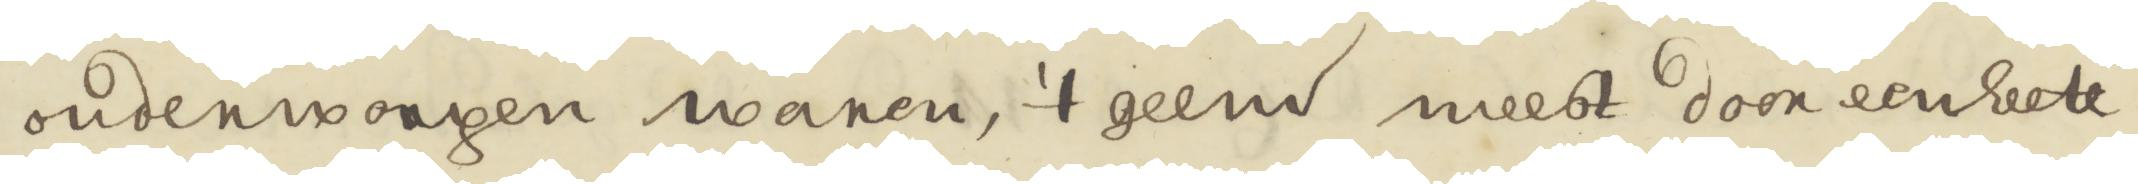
onderworpen waren, ’t geene meest door een heete
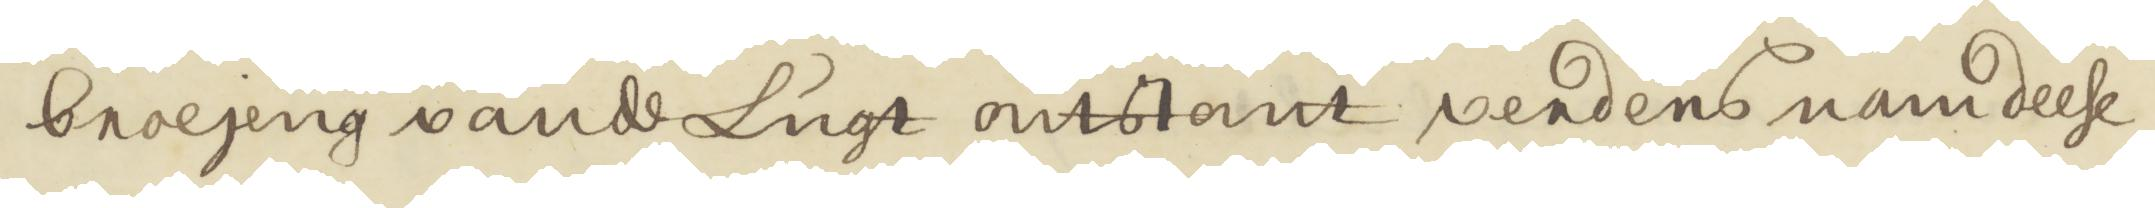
broejeng vande Lugt ontstant verders nam deese
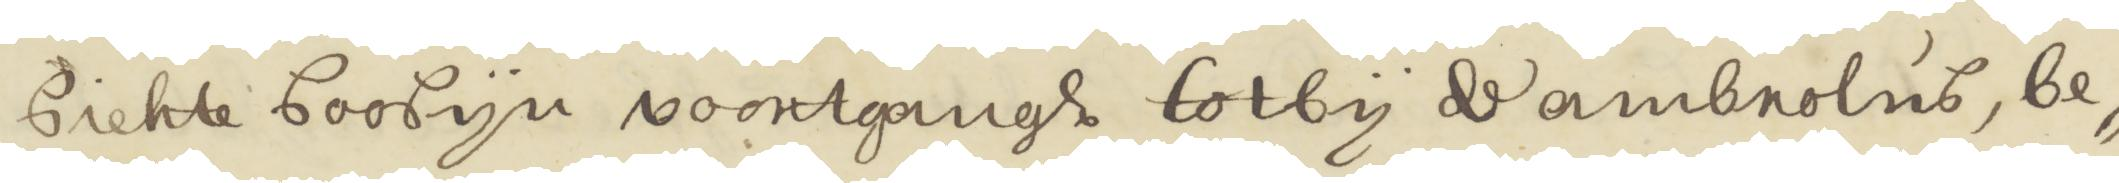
siekte soosijn voortgangh totbij de ambrolus, be„
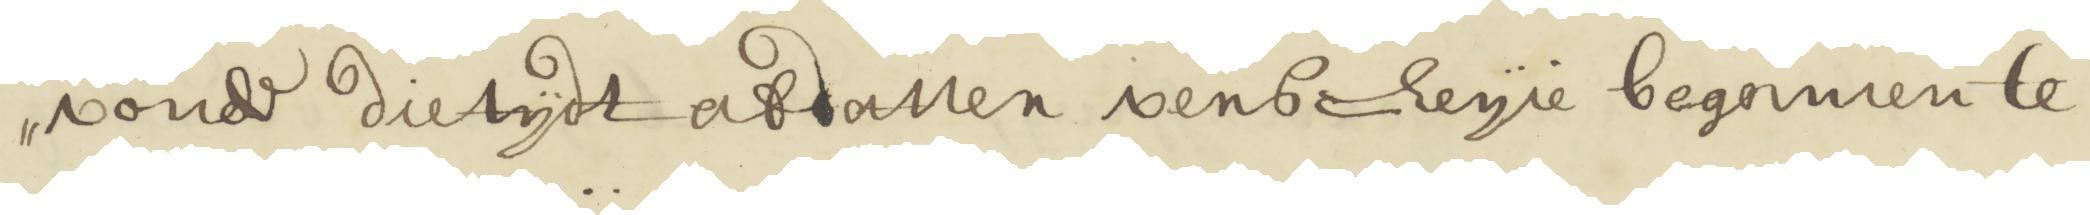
„vonde die tijdt afdatter verscheijie begonnen te
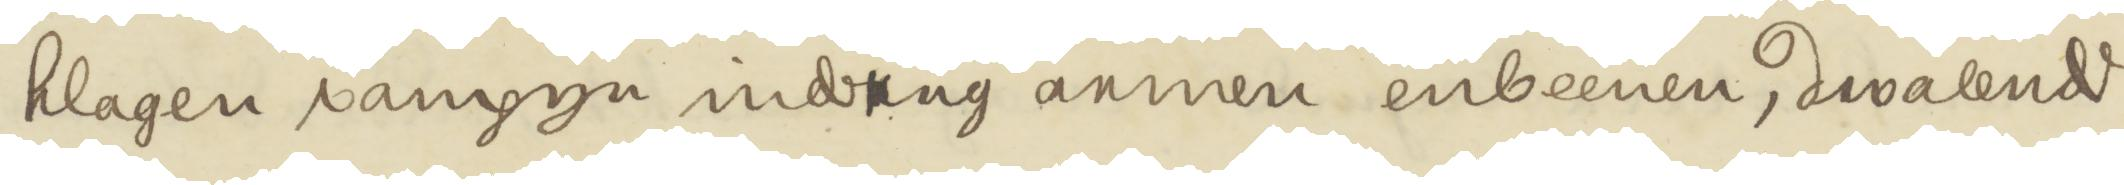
klagen van pijn inderug armen en beenen, dwalende
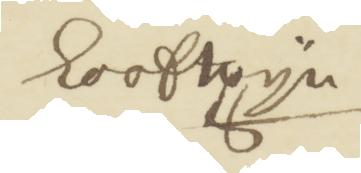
hooftpijn
